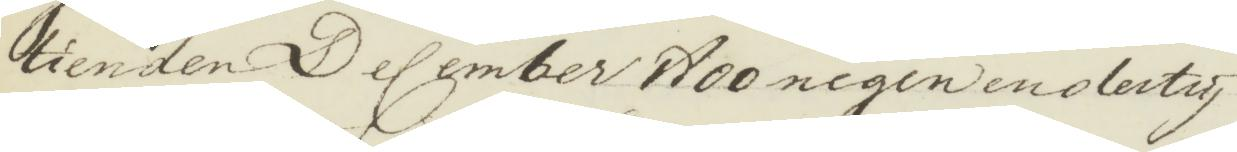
tienden December 18oo negen en dertig
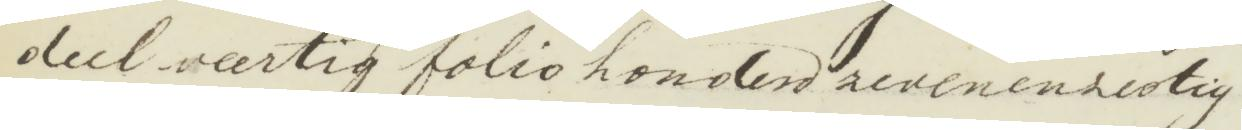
deel veertig folio honderd zevenenzestig
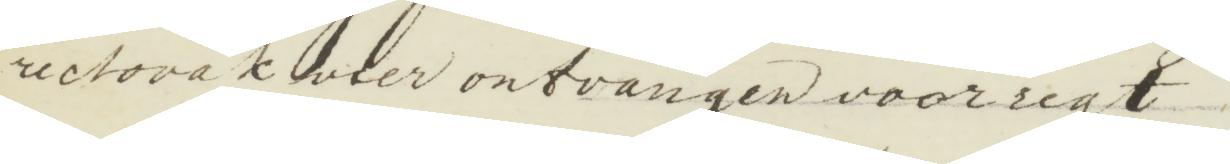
rectovak vier ontvangen voor regt
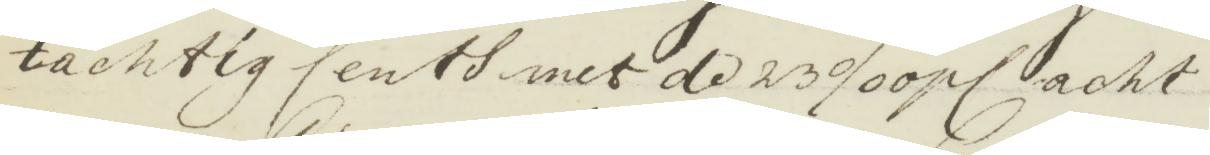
tachtig Cents met de 23% opC acht
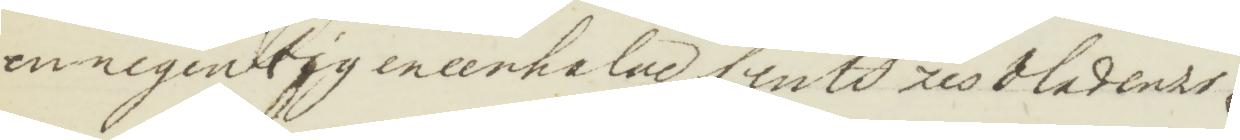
en negentig en eenhalve Cents zes bladenzr
